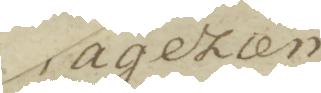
agezien
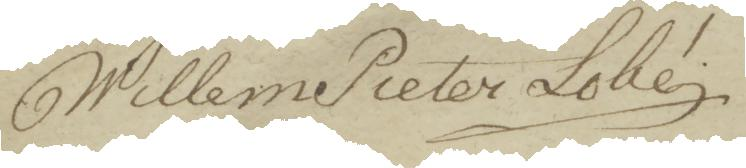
Willem Pieter Lobéj
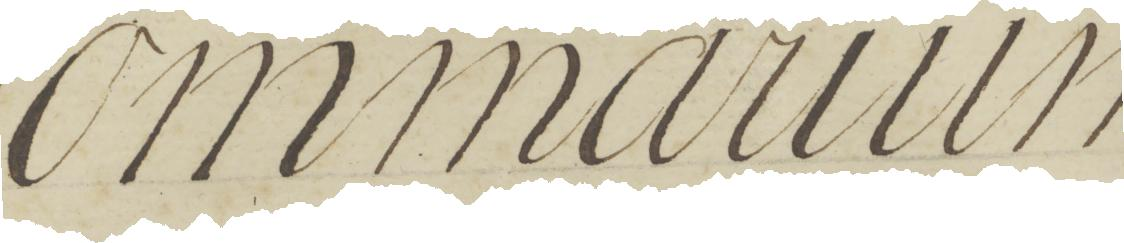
ommarium
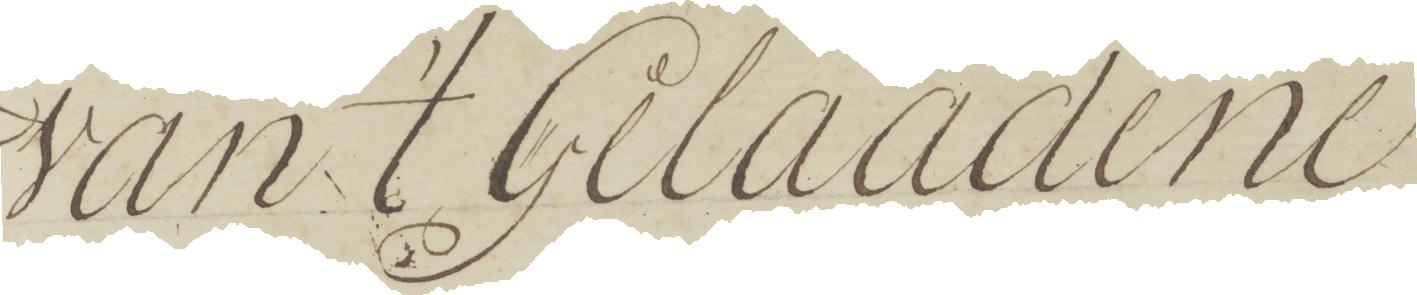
van ’t Gelaadene
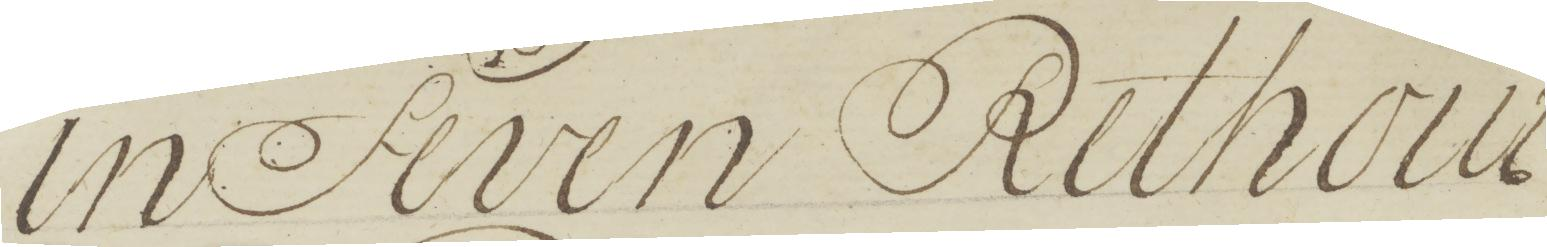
in Seven Rethour
